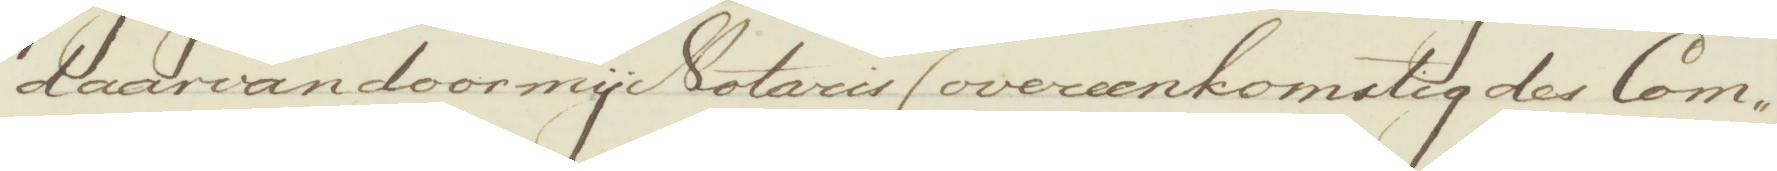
daarvan door mij Notaris (overeenkomstig der Com„
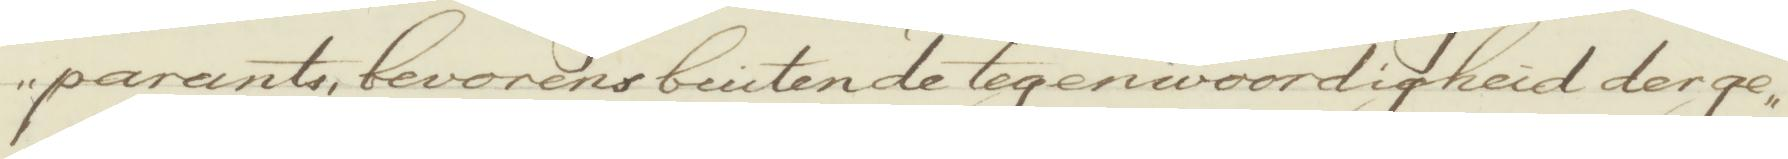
„parants, bevorens buiten de tegenwoordigheid der ge„
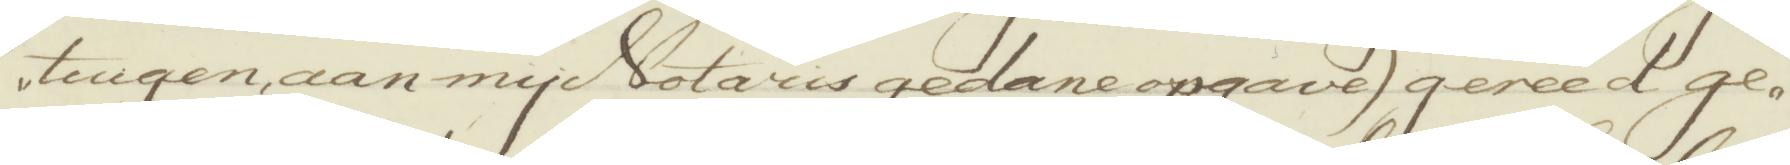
„tuigen, aan mij Notaris gedane opgave) gereed ge„
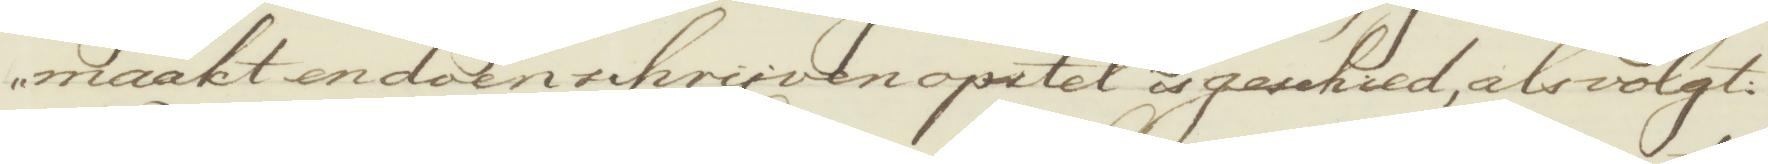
„maakt en doen schrijven opstel is geschied, als volgt:
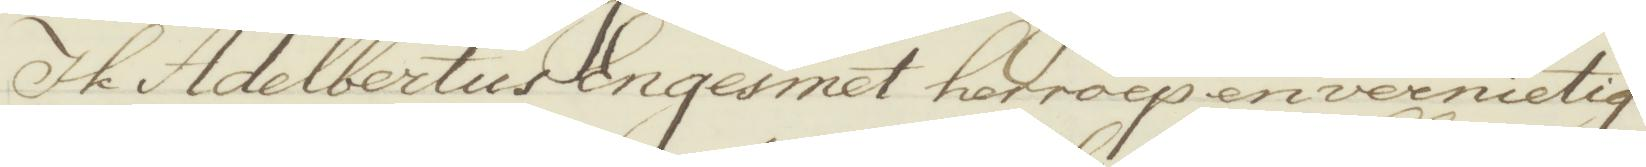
Ik Adelbertus Engesmet herroep en vernietig
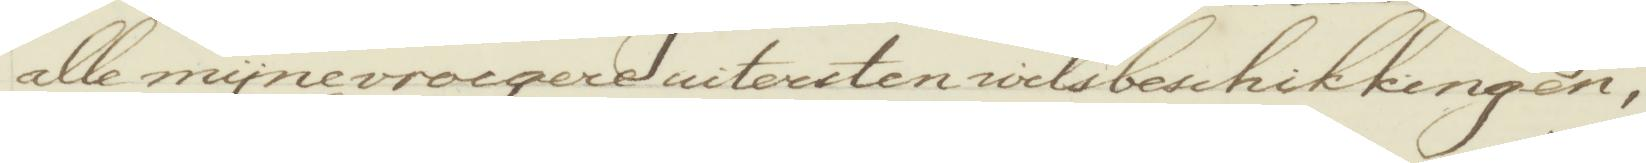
alle mijne vroegere uitersten wilsbeschikkingen,
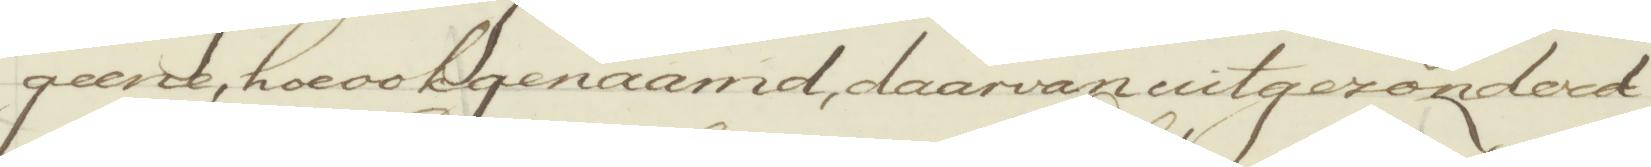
geene, hoe ook genaamd, daarvan uitgezonderd
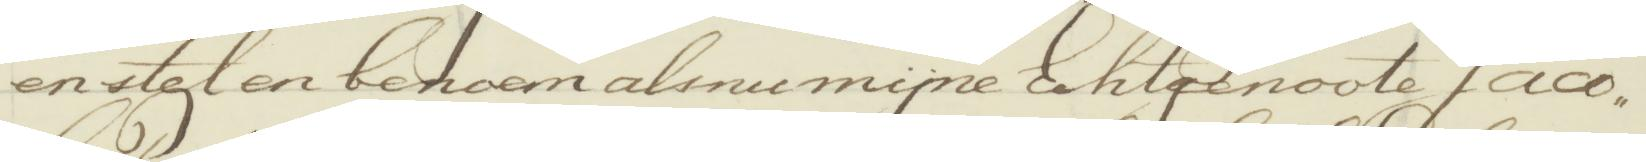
en stel en benoem alsnu mijne Echtgenoote Jaco„
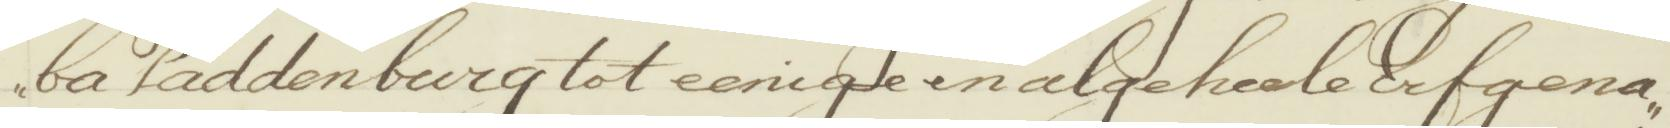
„ba Paddenburg tot eenige en algeheele Erfgena„
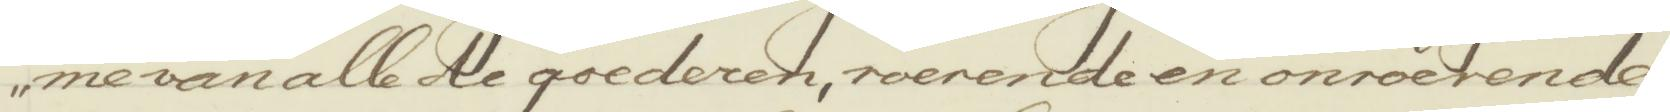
„me van alle de goederen, roerende en onroerende,
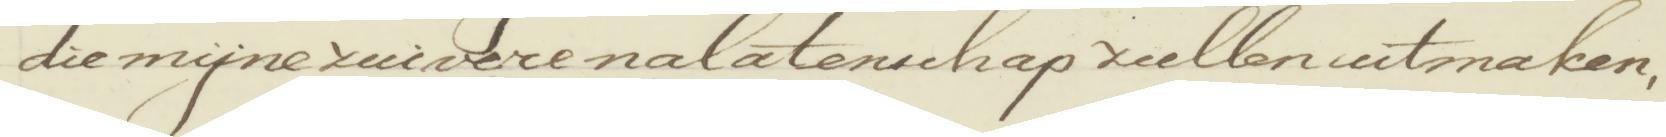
die mijne zuivere nalatenschap zullen uitmaken,
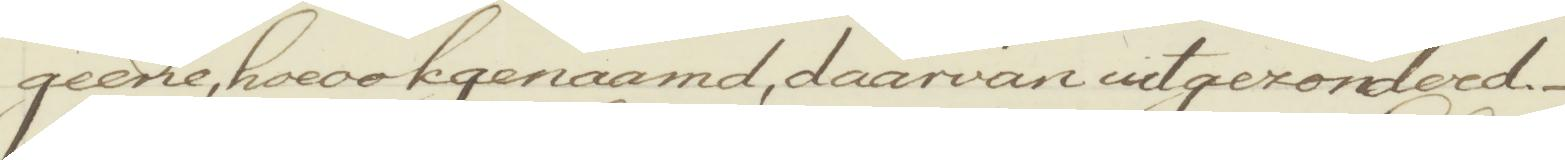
geene, hoeookgenaamd, daarvan uitgezonderd.
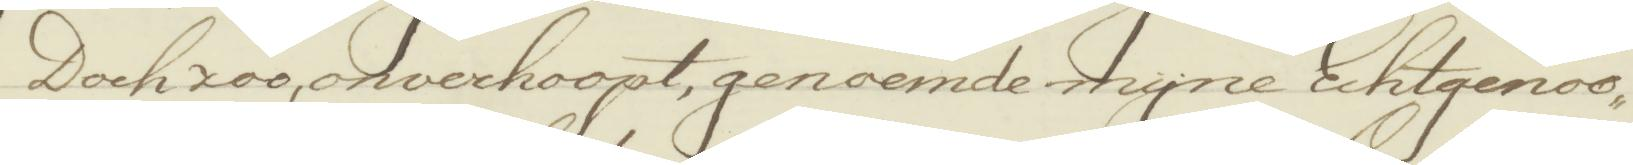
Doch zoo, onverhoopt, genoemde mijne echtgenoo„
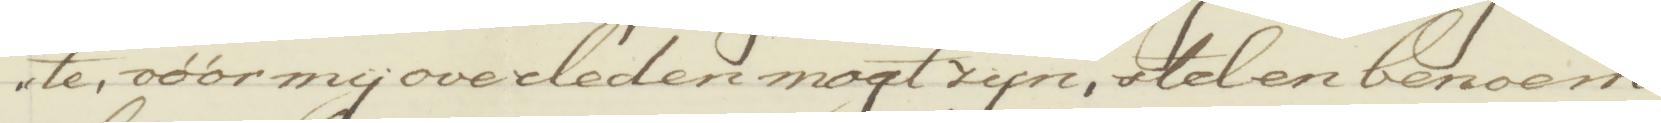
„te, vóór mij overleden mogt zijn, stel en benoem
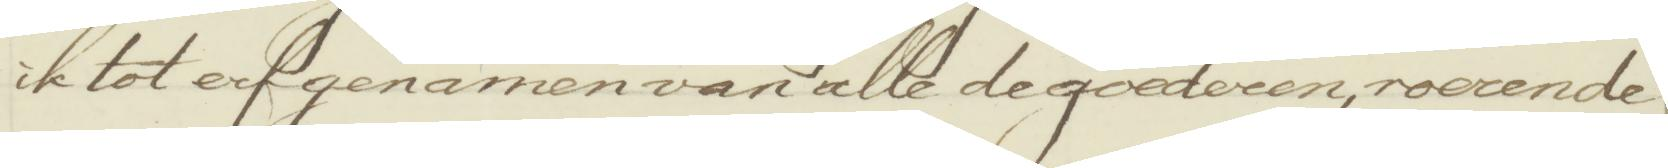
ik tot erfgenamen van alle de goederen, roerende
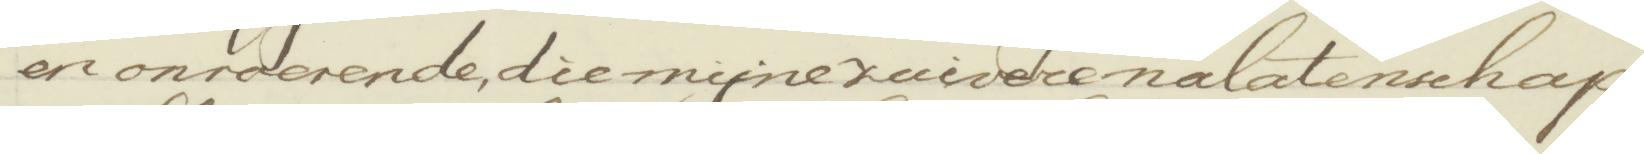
en onroerende, die mijne zuivere nalatenschap
